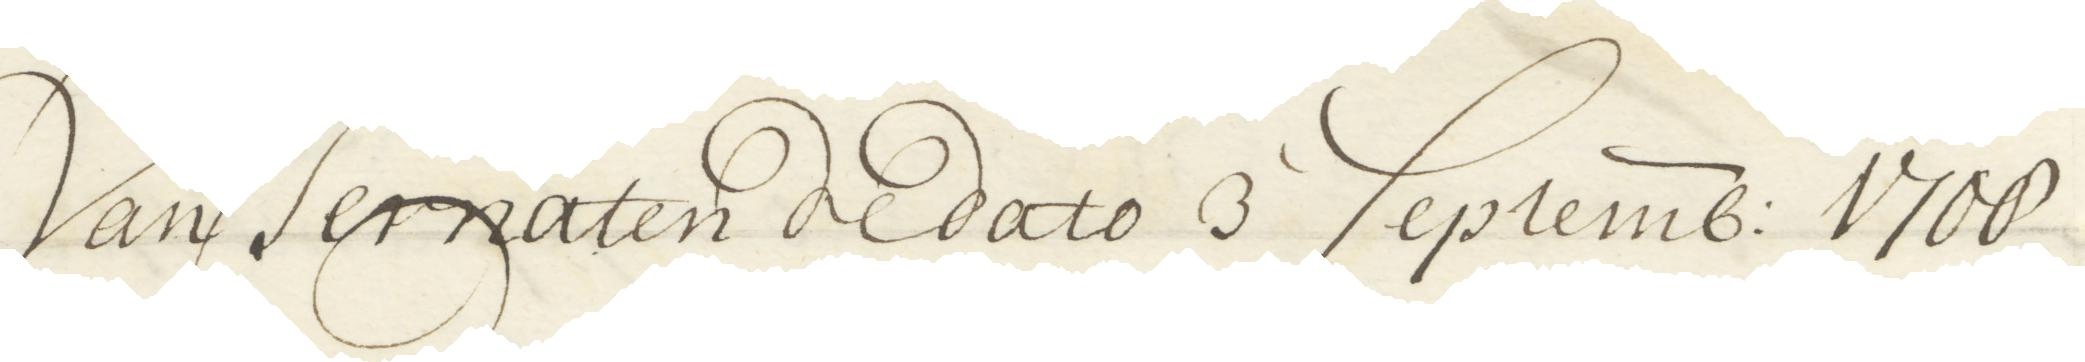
Van Ternaten de dato 3' Septemb: 1708
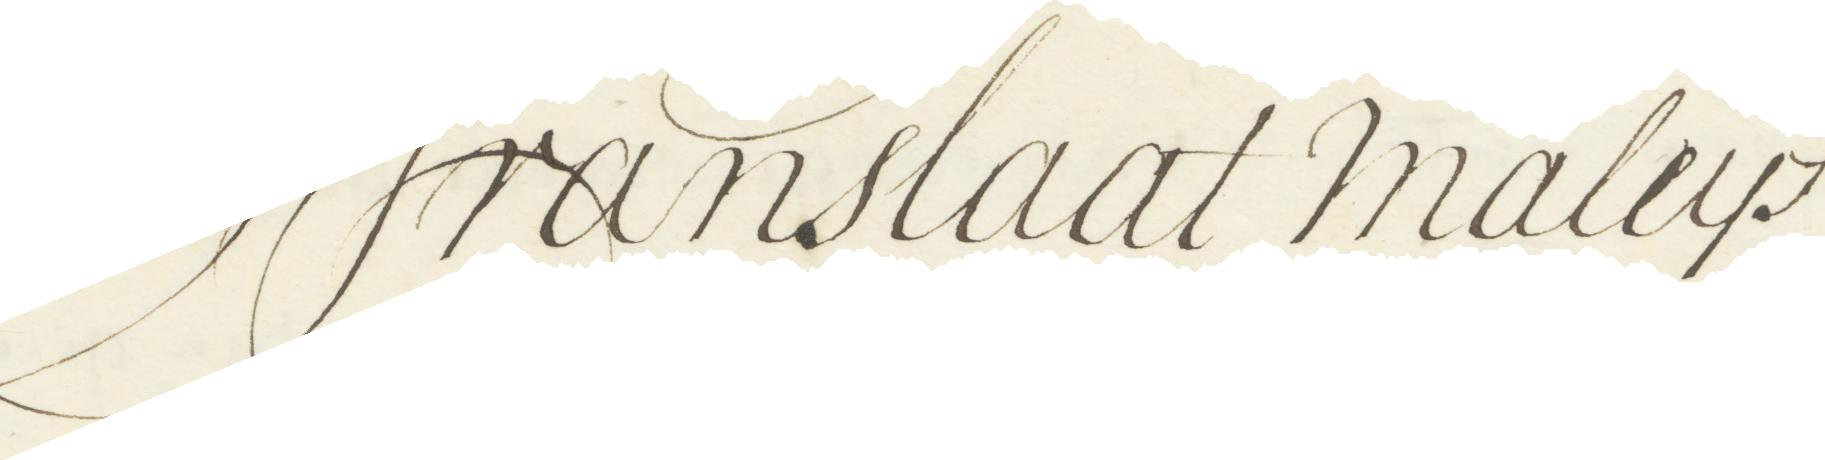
Translaat maleijs
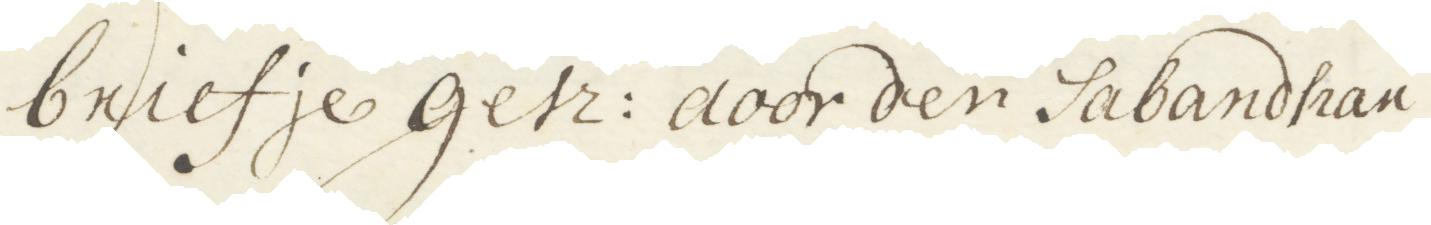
briefje gesz: door den Sabandhar
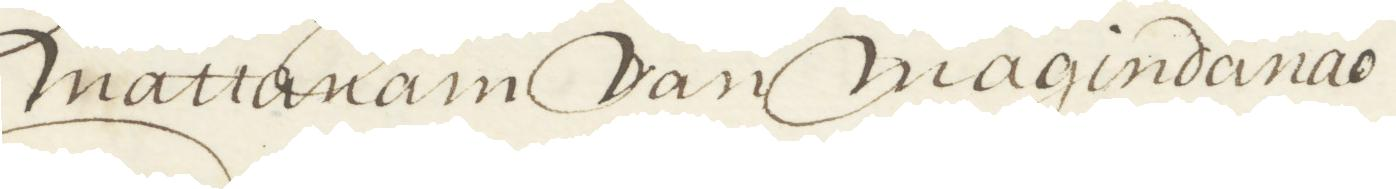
mattanam van Magindanao
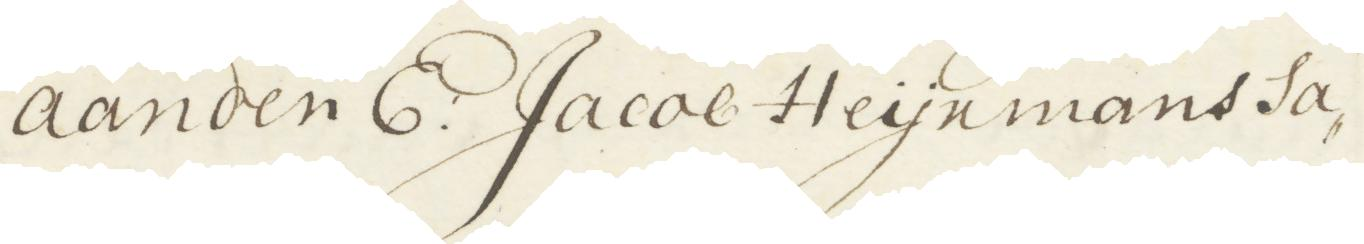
aan den E: Jacob Heijrmans sa„
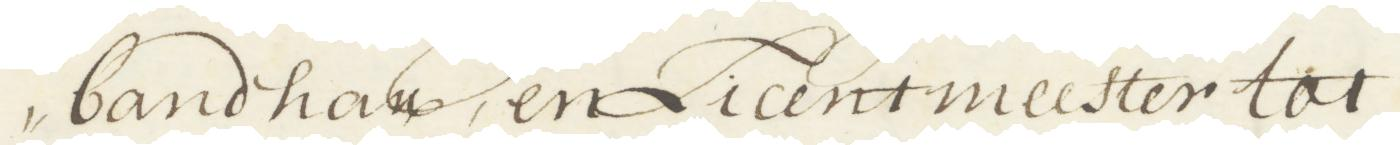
„bandhar, en licentmeester tot
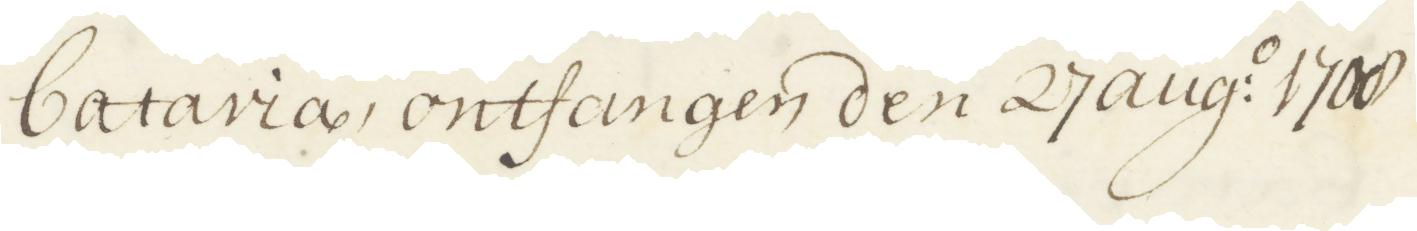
batavia, ontfangen den 27 aug:o 1708
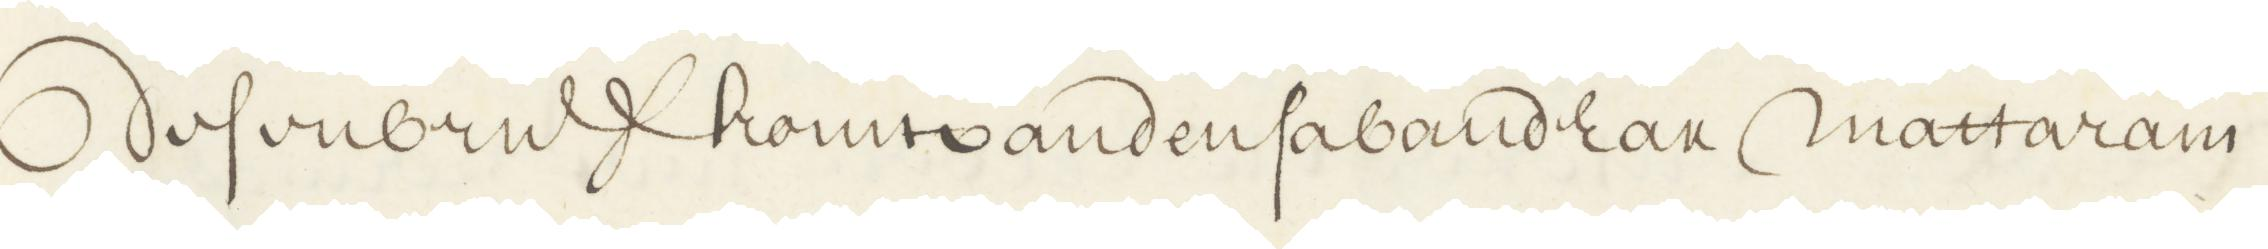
desen brief komt van den sabandhar mattaram
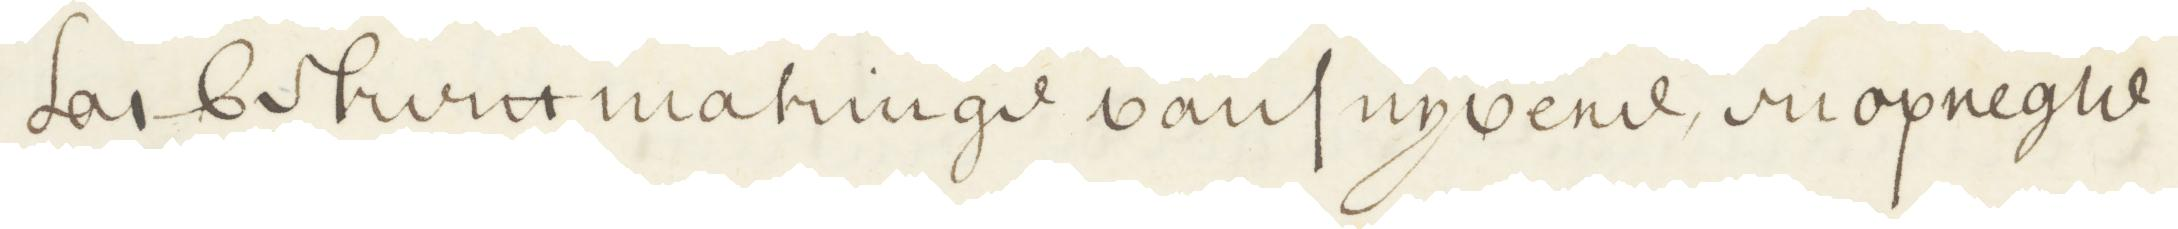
tot bekent makinge van suyvere, en opregte
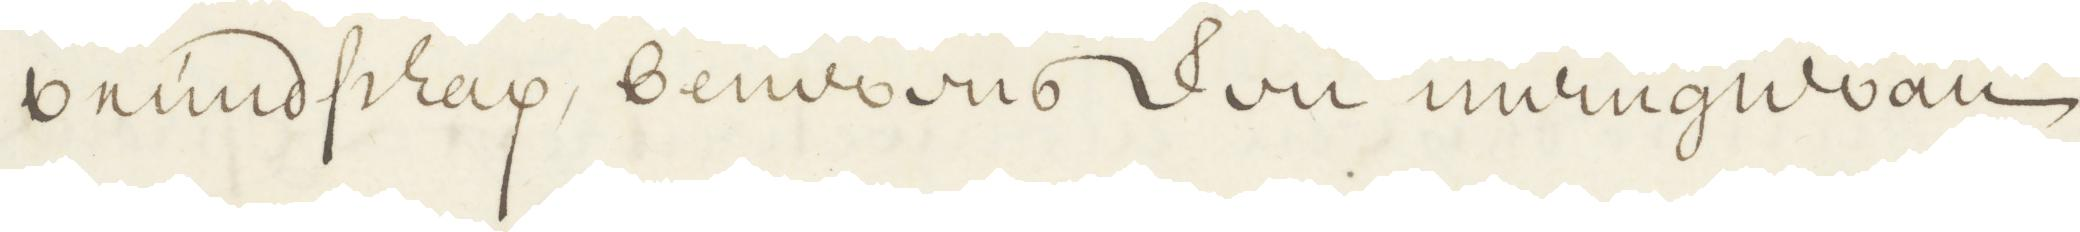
vrundschap, benevens Een menigte van
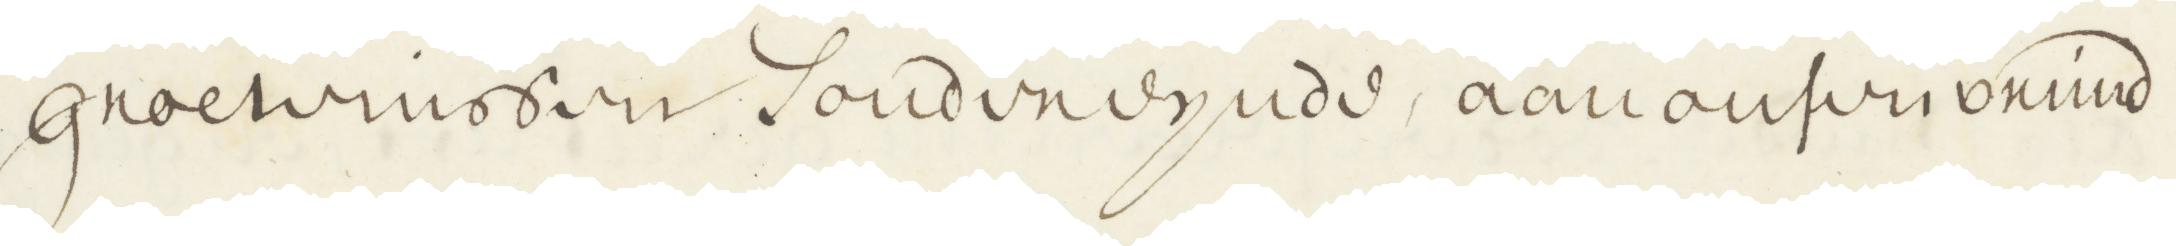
groetenissen sondereynde, aan onsen vrund
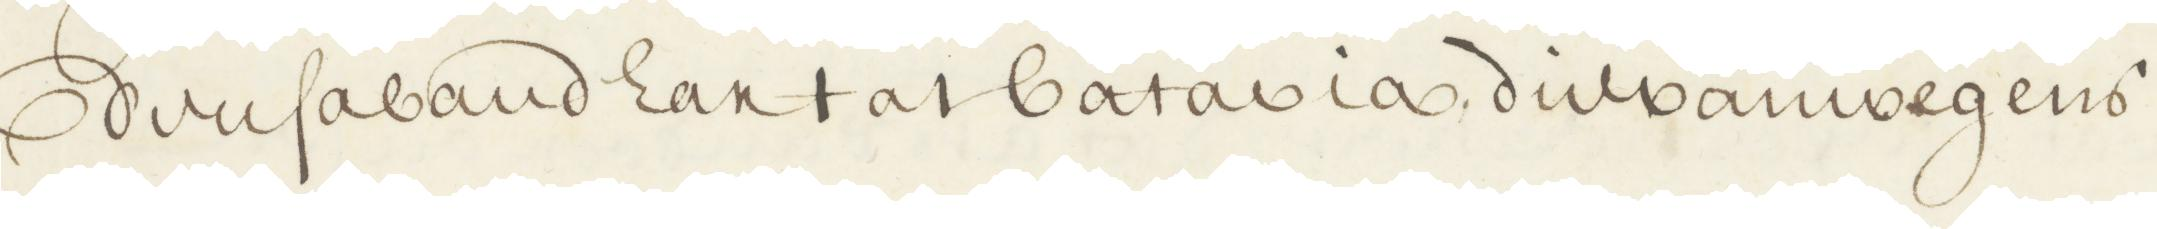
den sabandhar tot batavia, die vanwegens
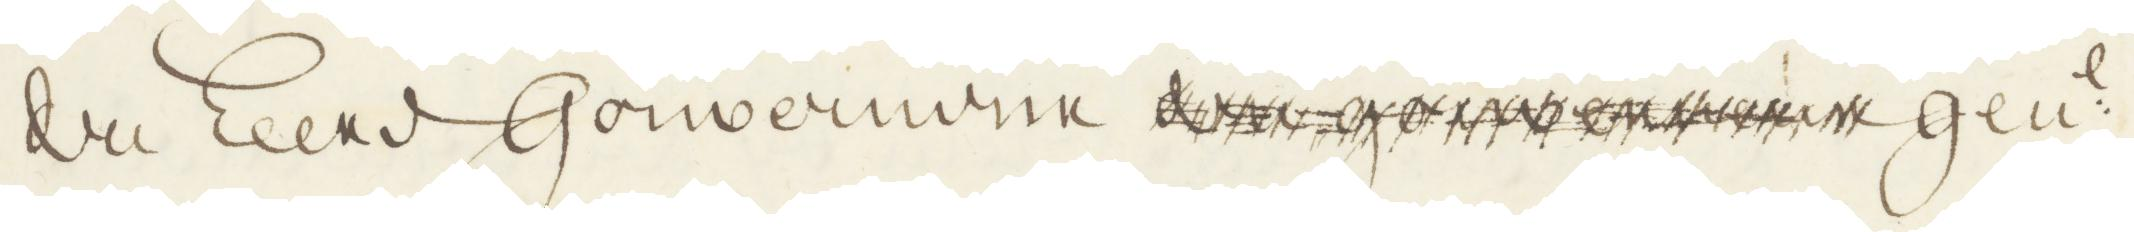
den heere Gouverneur den gouverneur gen:l
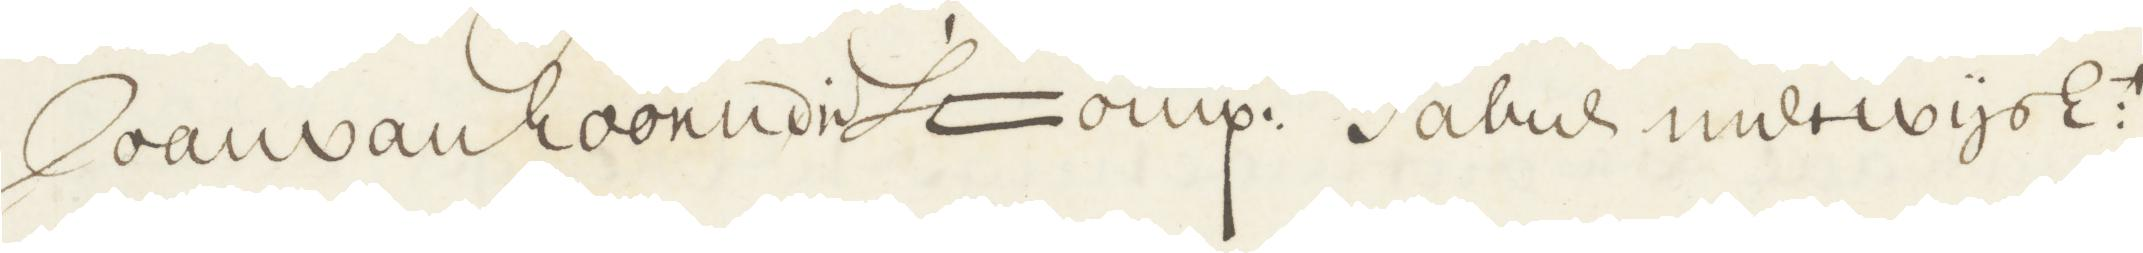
Joan van hoorn die 's Comp:s saken met wijsh:t
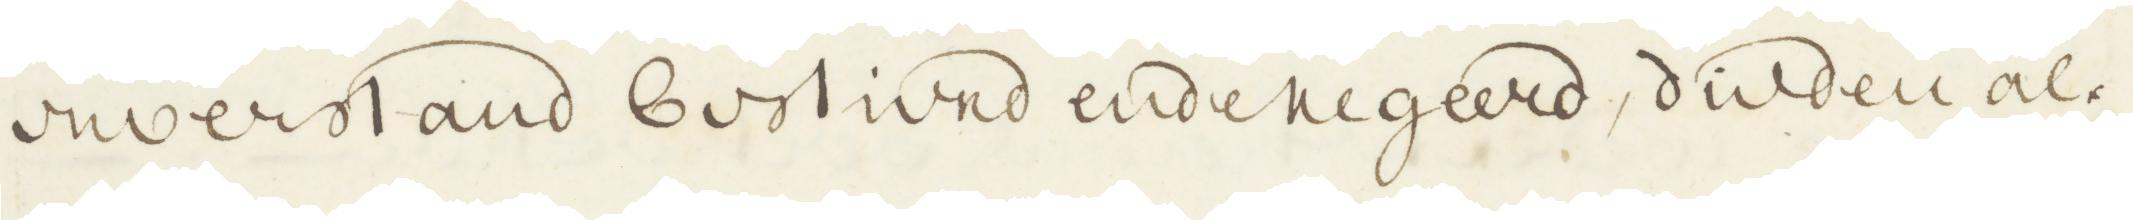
en verstand bestierd ende regeerd, die den al„
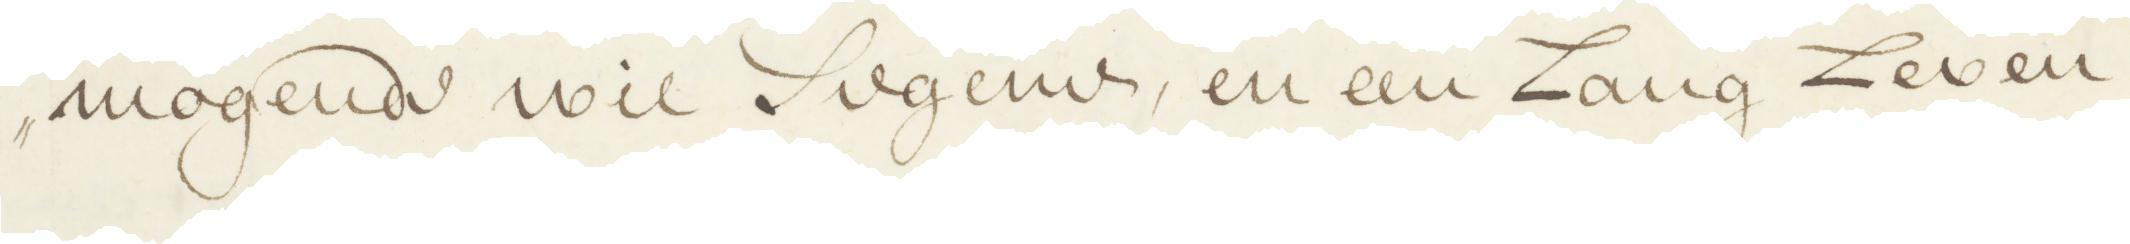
„mogende wil segene, en een lang leven
